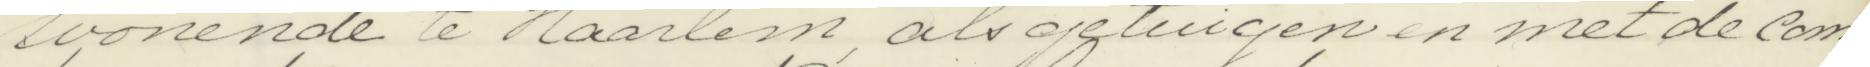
wonende te Haarlem als getuigen en met de Com
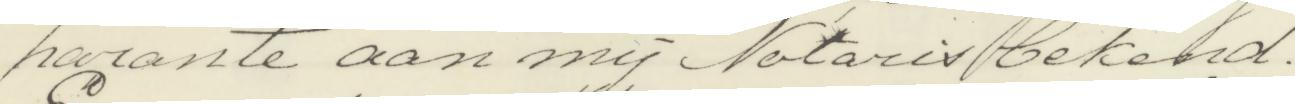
parante aan mij Notaris bekend
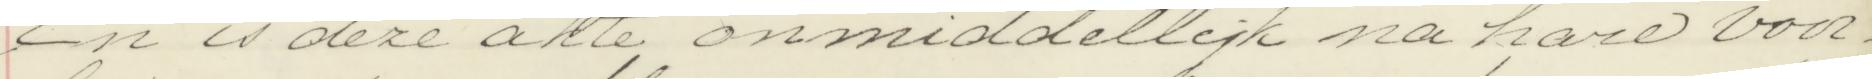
En is deze akte onmiddellijk na hare voor
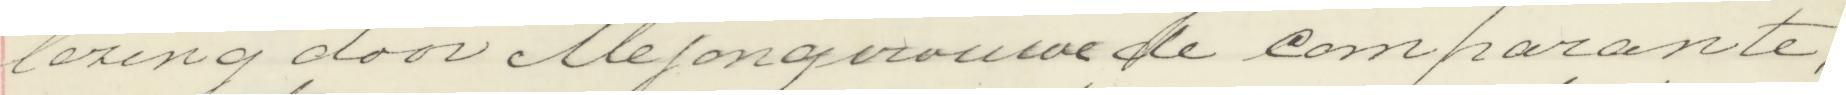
lezing door Mejongvrouwe de comparante,
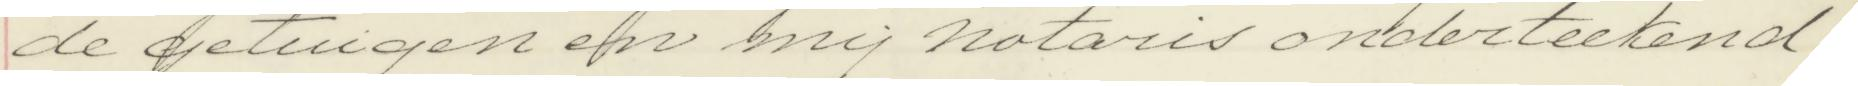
de getuigen en mij notaris onderteekend -
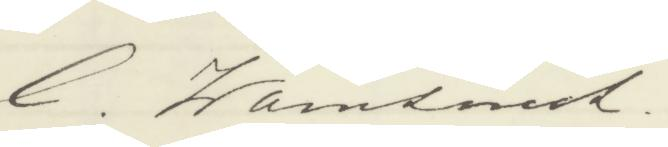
C. Warnsinck.
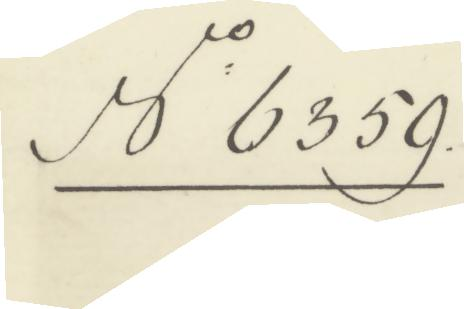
N=o 6359
